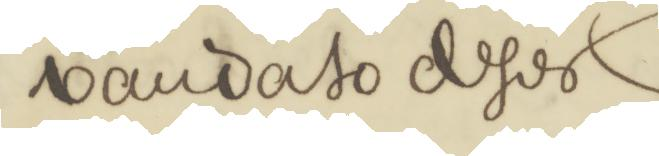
van dato deses
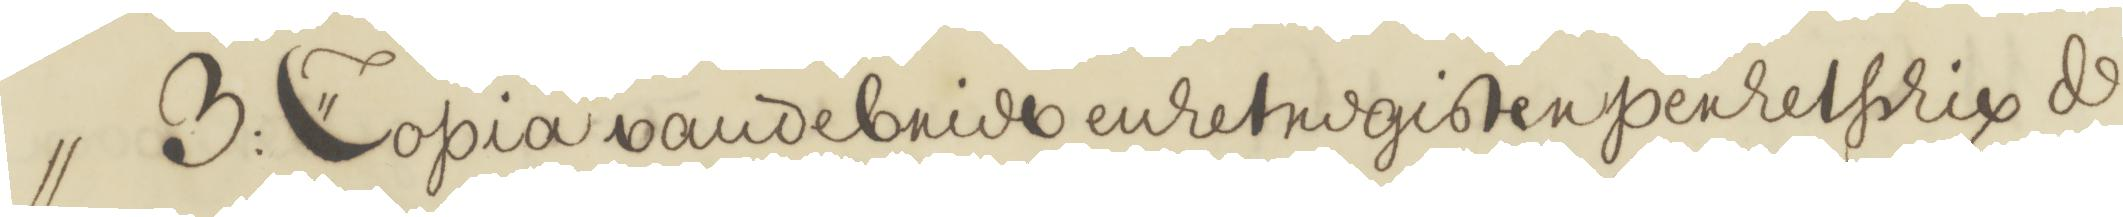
„ 3: Copia van de briev en het register per het schip de
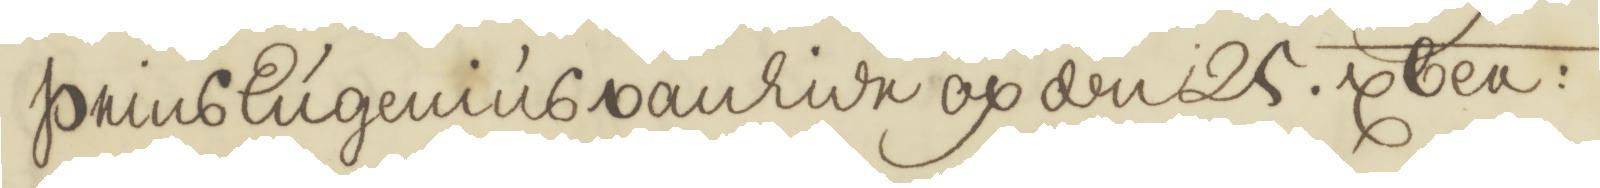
prins Eugenius van hier op den 25. xber:
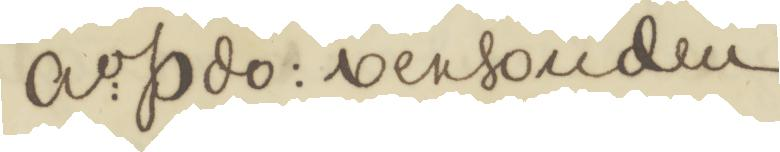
a:o pdo: versonden
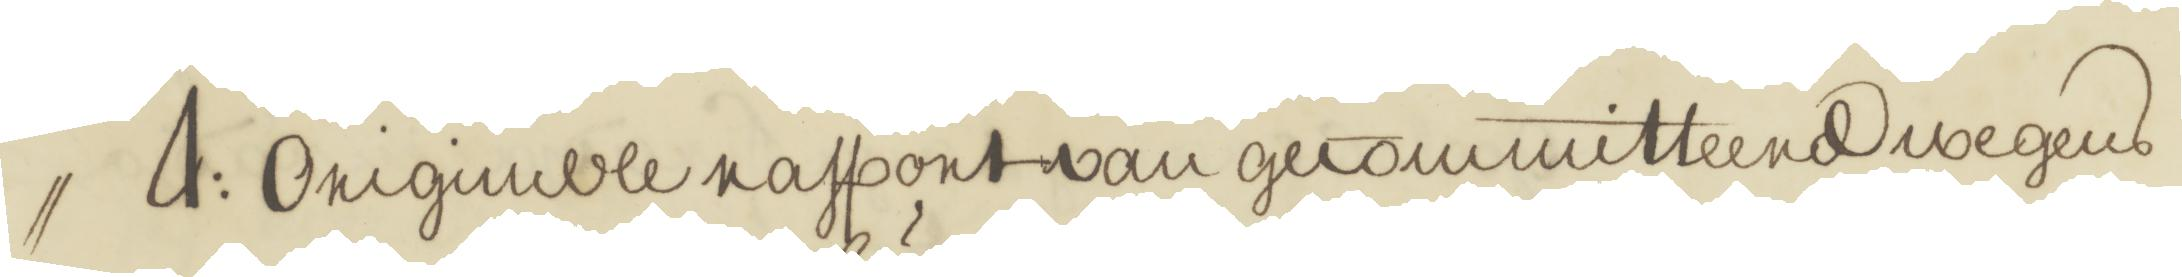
„ 4: Origineele rapport van gecommitteerd wegens
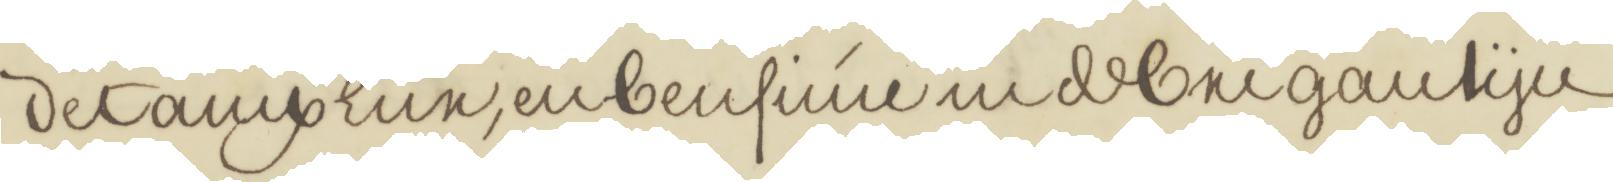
de camphur, en bensiun in de brigantijn
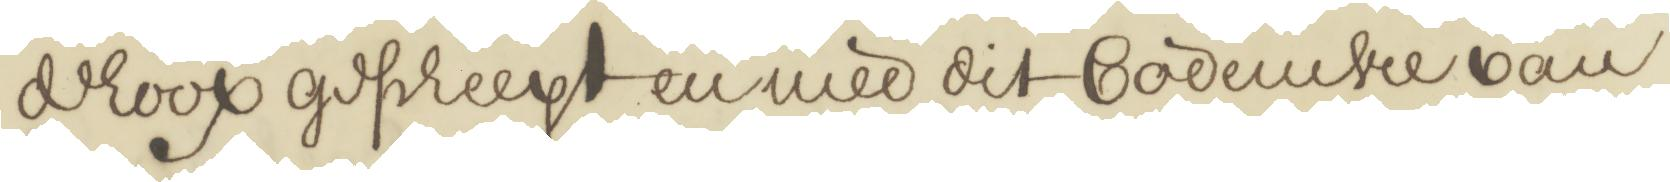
de hoop gescheept en med dit bodemke van
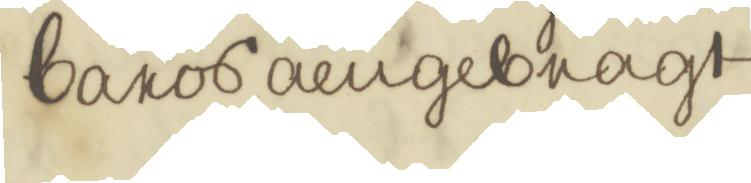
baros aengebragt
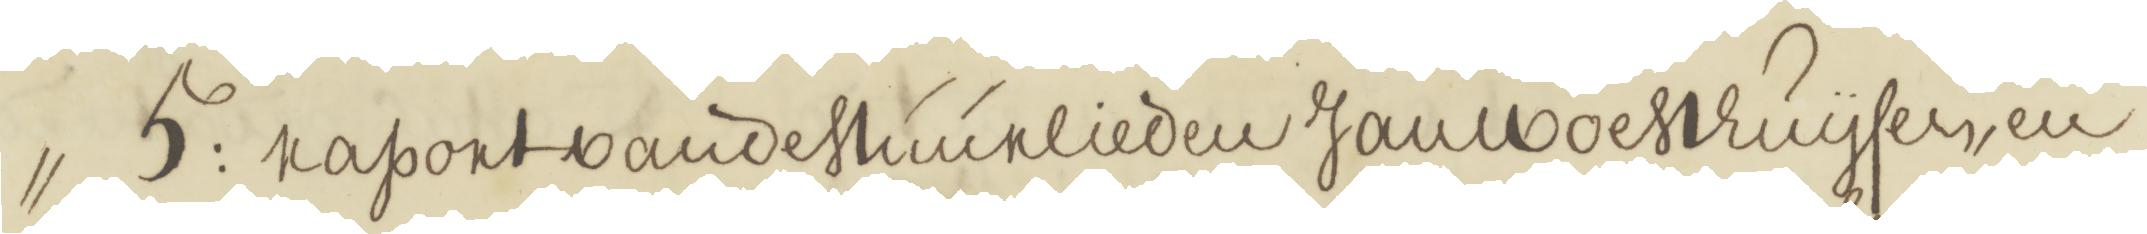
„ 5: raport van de stuurlieden Jan woesthuijsen, en
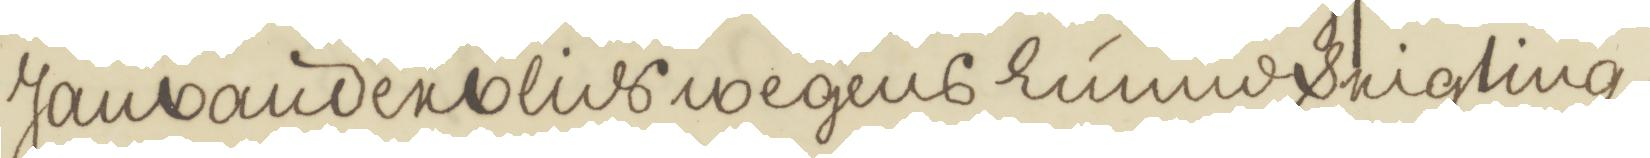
Jan van der vlies wegens hunne verrigting
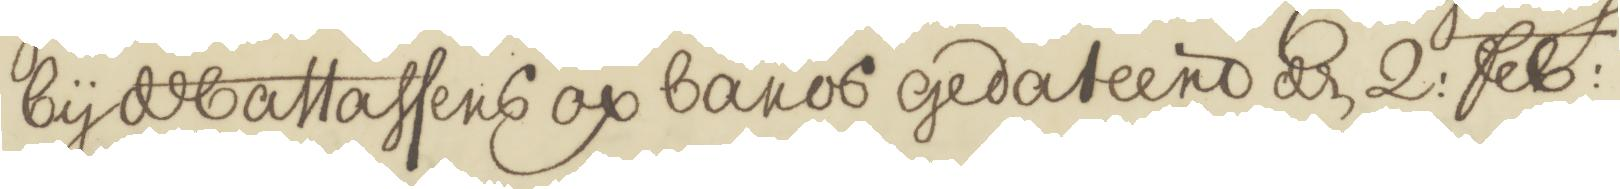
bij de battassers op baros gedateerd den 2: feb:
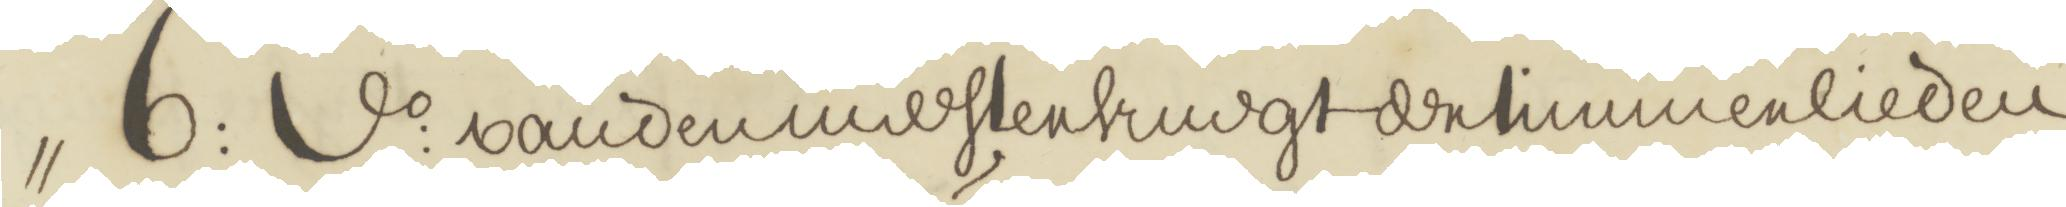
„ 6: D:o van den meesterknegt der timmerlieden
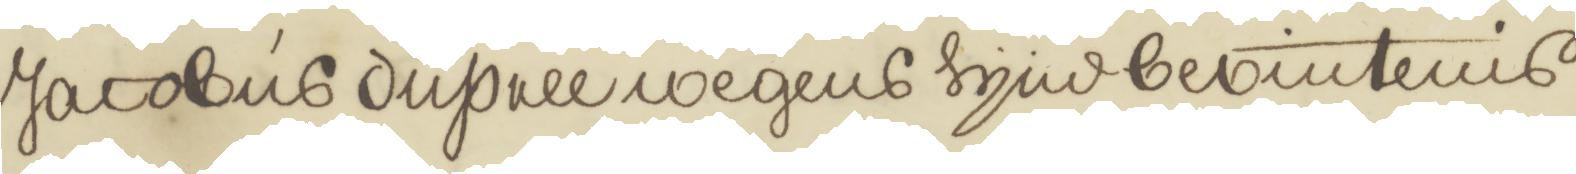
Jacobus dupree wegens sijne bevintenis
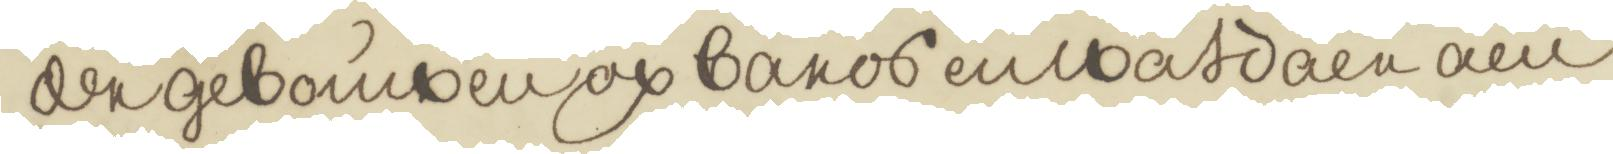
der gebouwen op baros en wat daer aen
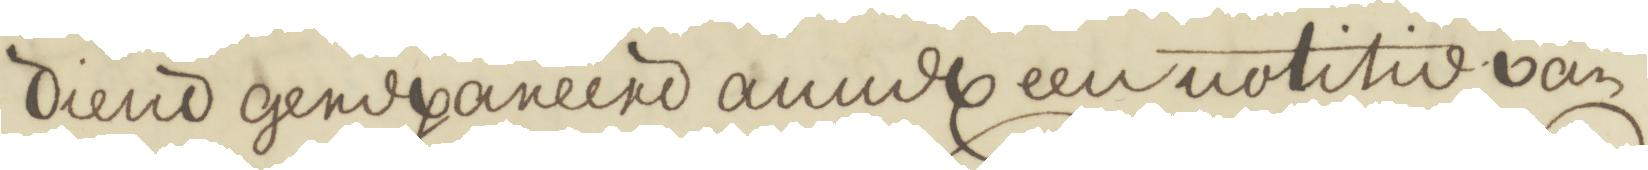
diend gerepareerd annex een notitie van
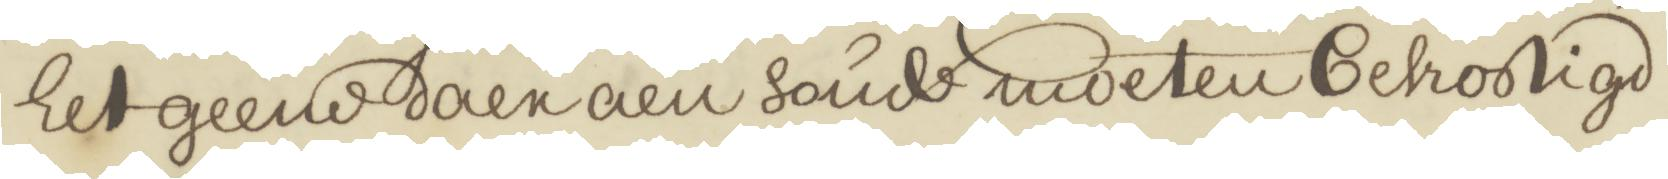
het geene daer aen soude moeten bekostigd
